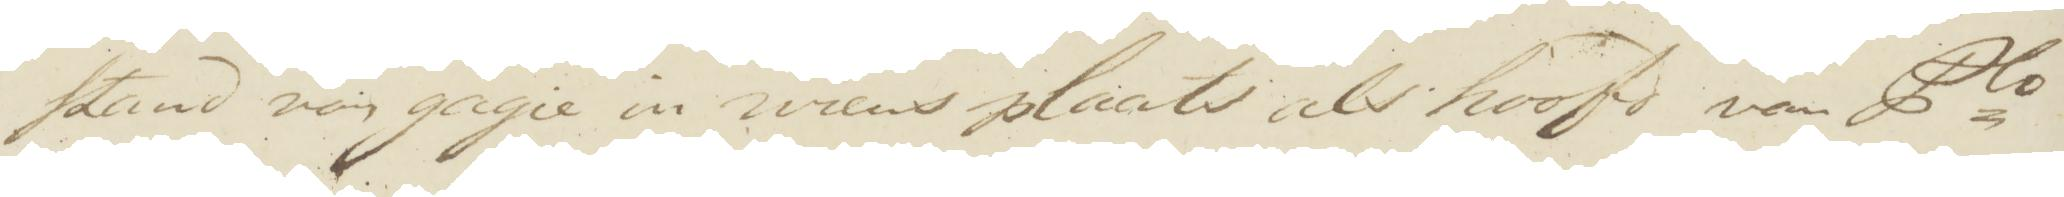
stand van gagie in wiens plaats als hoofd van P=lo
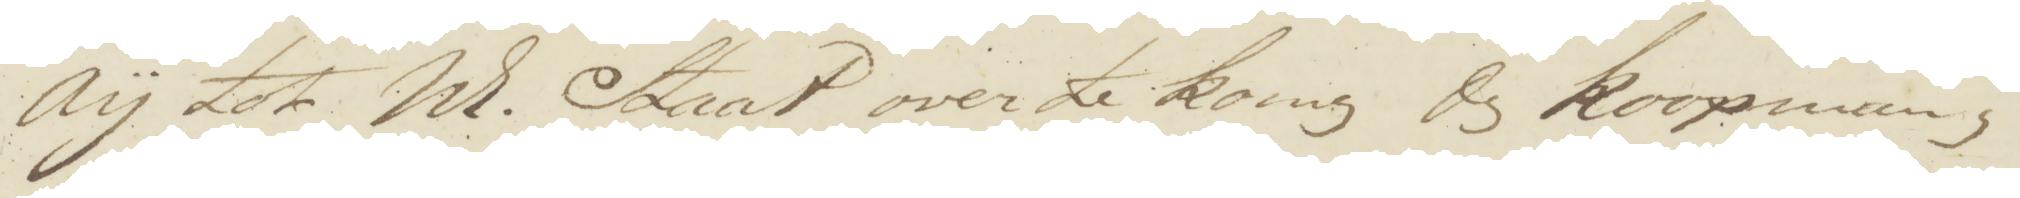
aij tot UE. staat over te komen den koopman en
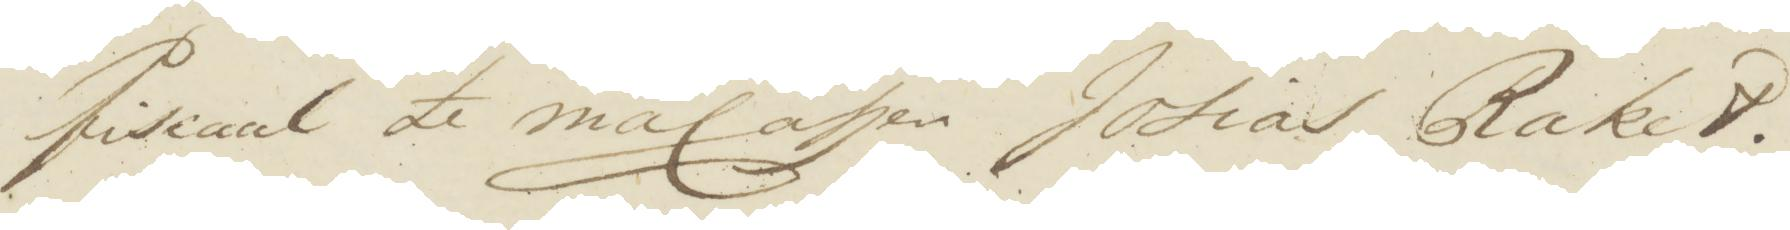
fiscaal te macasser Josias Raket.
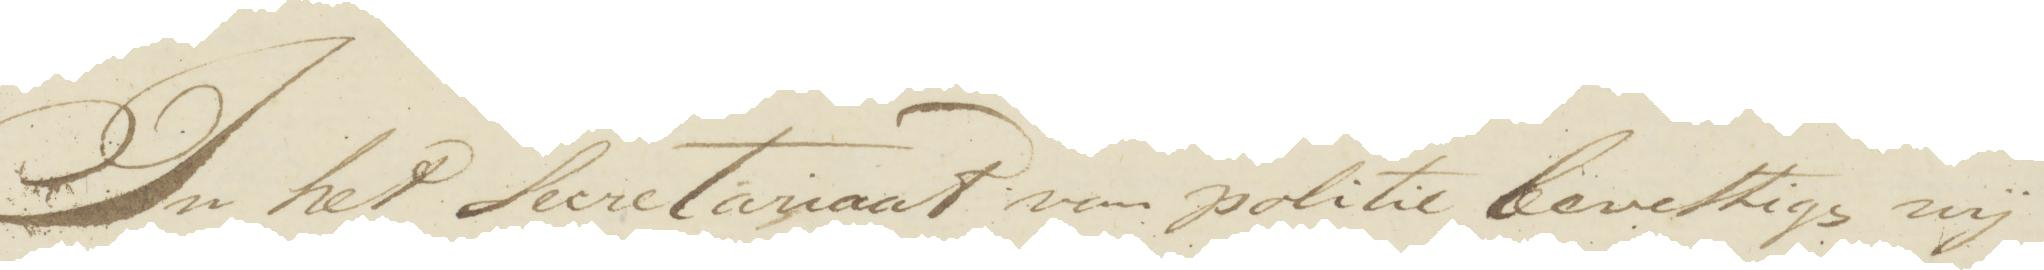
In het secretariaat van politie bevestigen wij
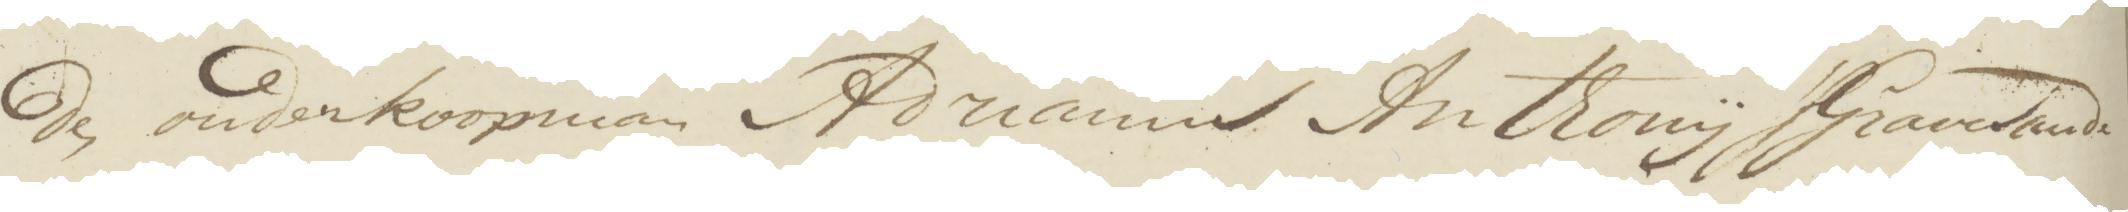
den onderkoopman Adrianus Anthonij 's Gravesande
